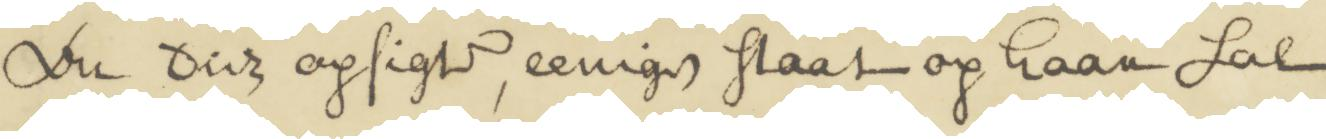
ten dien opsigte, eenigen staat op haar sal
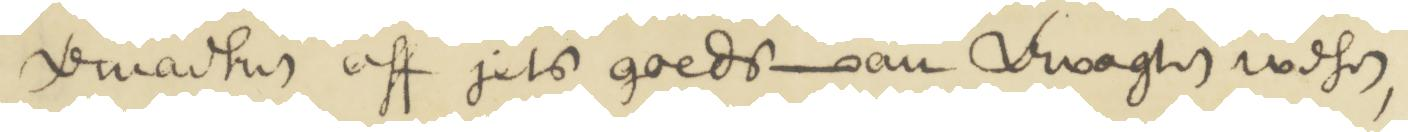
temaeken off jets goeds van tewagten wesen,
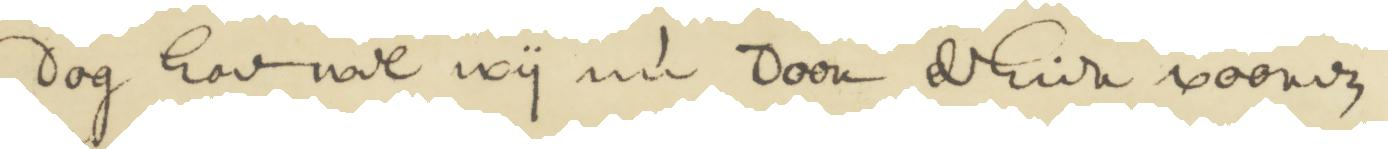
dog hoe wel wij nu door de hier vooren
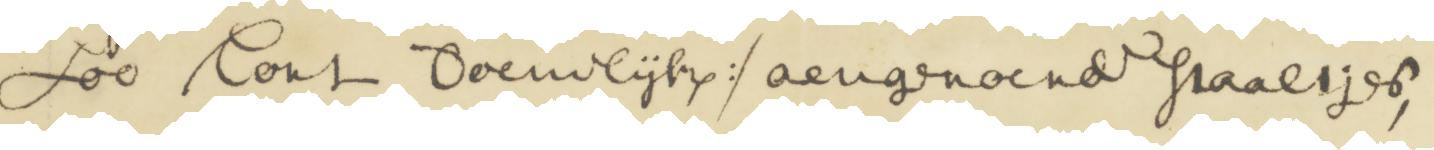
soo Kort doenelijk :/ aengeroerde staaltjes,
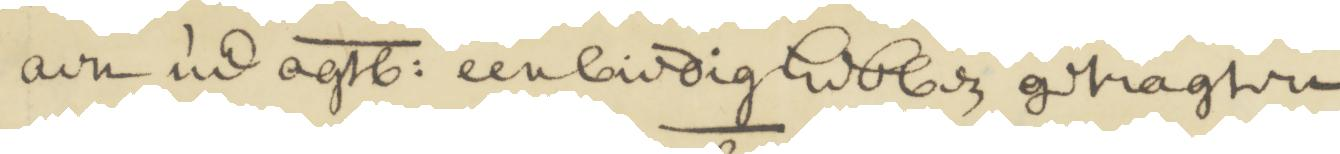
aen uE agtb: eerbiedig hebben getragten
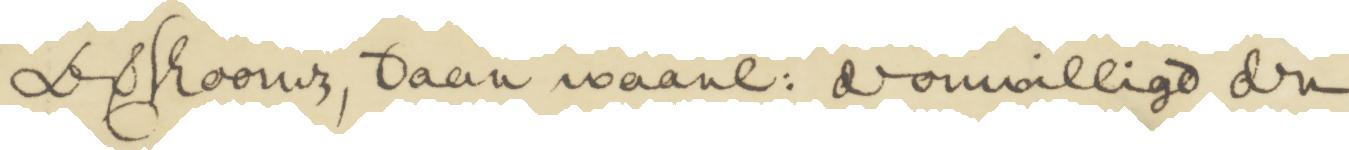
te verthoonen, daar waarl: deonwilligd der
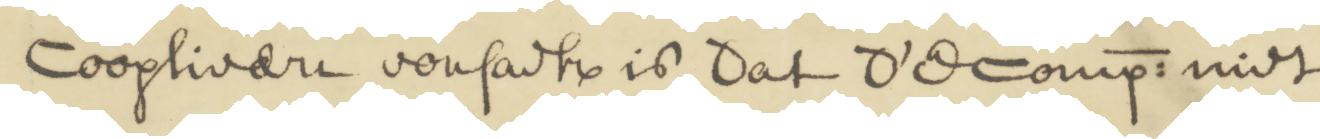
Cooplieden oorsaek is, dat d’E comp: niet
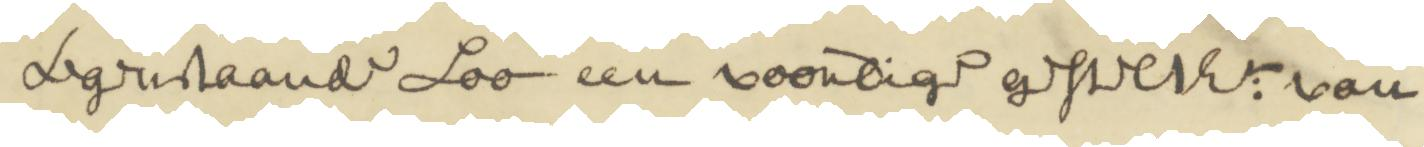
tegenstaande soo een voordige gestelth:r van
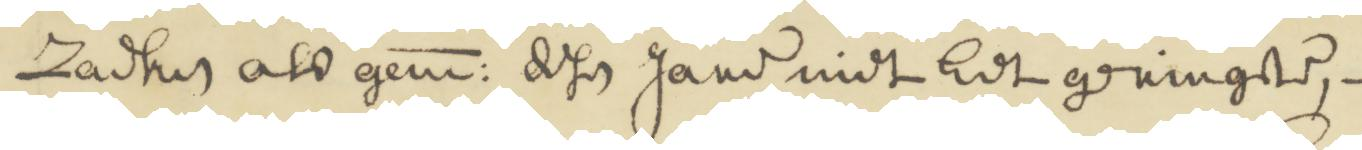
zaeken als gem: desen Jare niet het geringste,
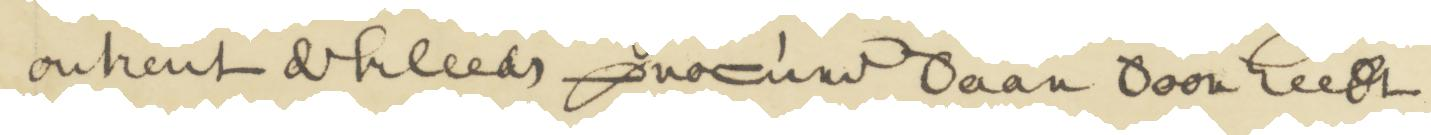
ontrent dekleeden procure daar door heeft
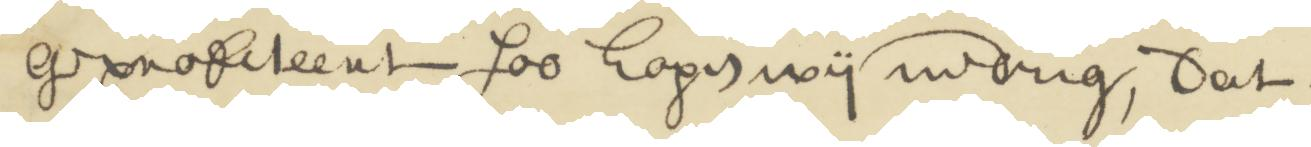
geprofiteert soo hopen wij nedrig, dat
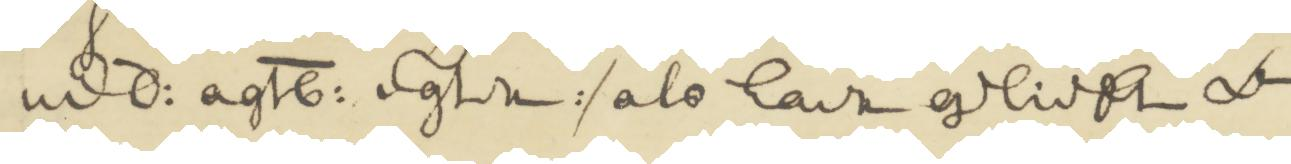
uEd: agtb: Egter :/ als haer gelieft te
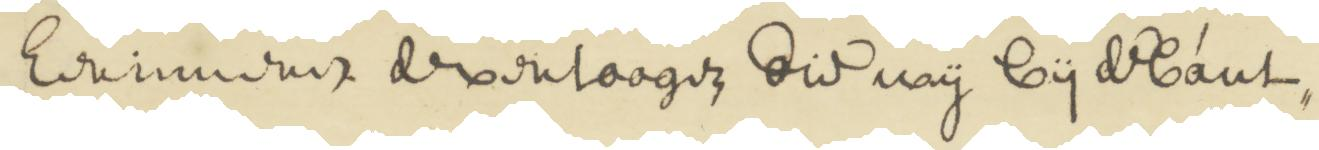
herinneren de vertoogen die wij bij de b'ant„
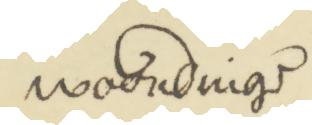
woordinge
